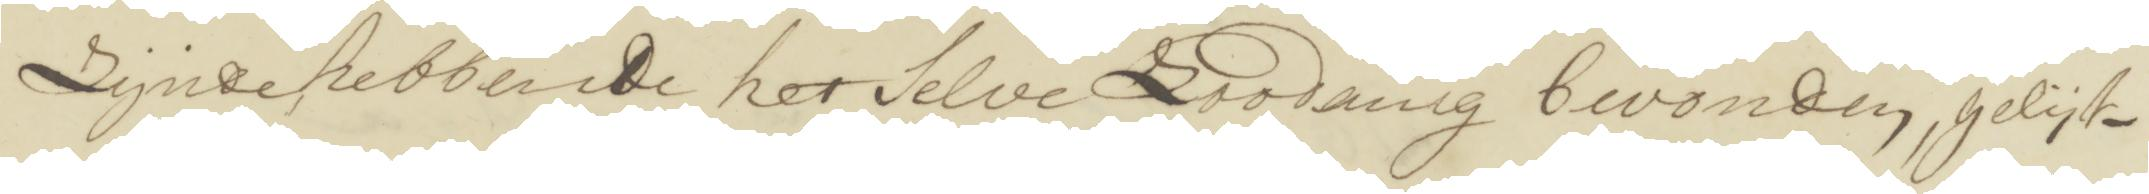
zijnde, hebbende het selve zoodanig bevonden, gelijk
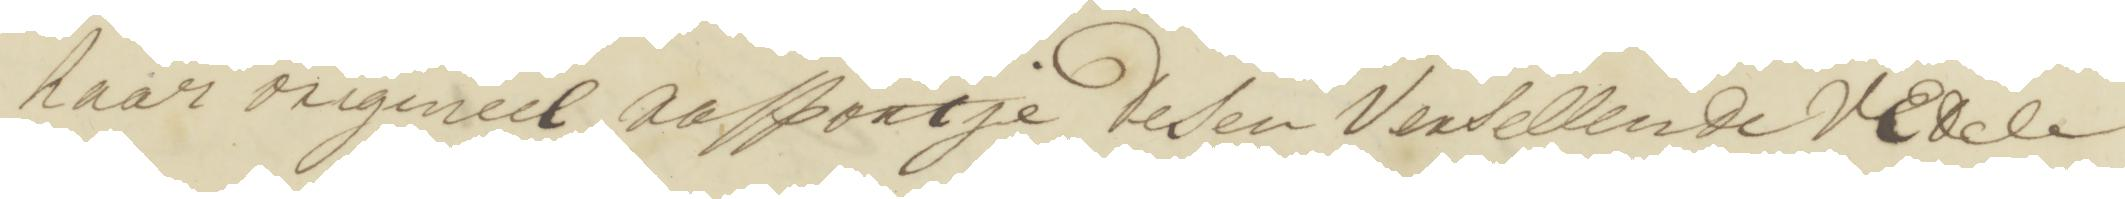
haar origineel rapportje desen versellende VEdele
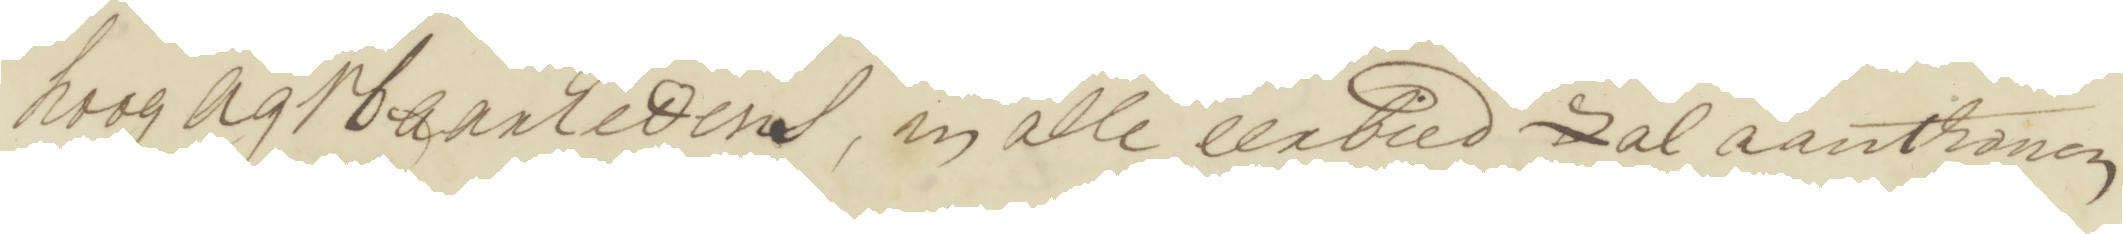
hoog agtbaarhedens, in alle eerbied zal aanthonen
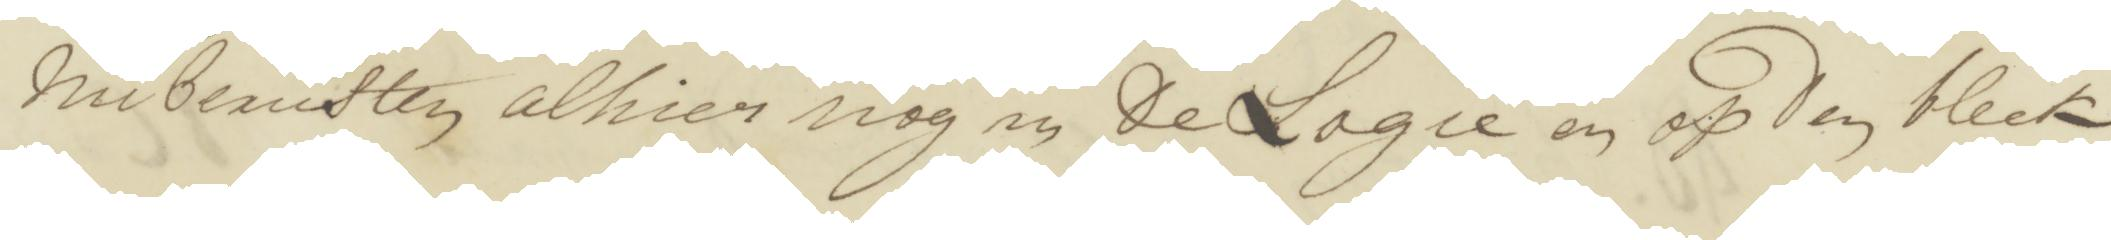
nu berusten alhier nog in de Logie en op den bleek
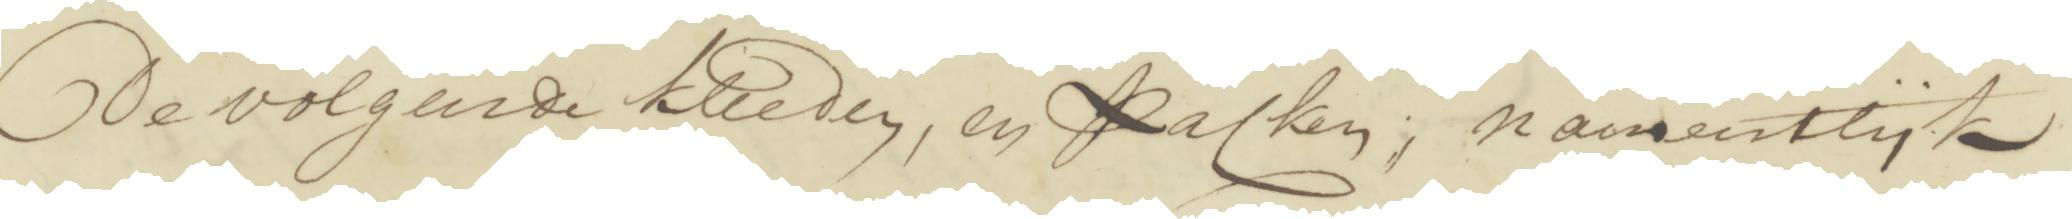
de volgende kleeden, en packen; namentlijk
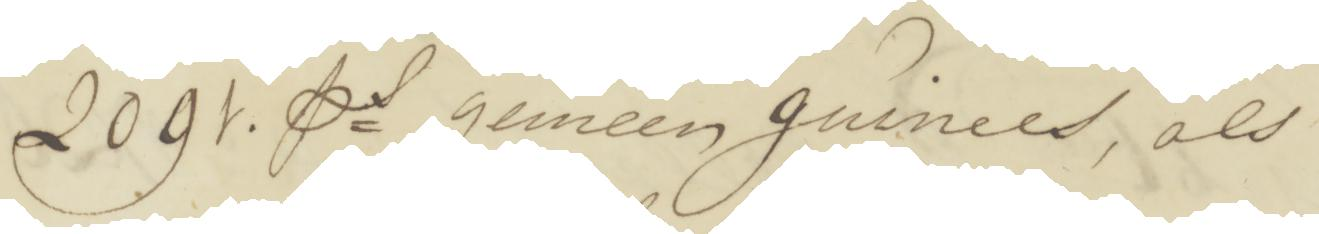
2091. p=s gemeen guinees, als
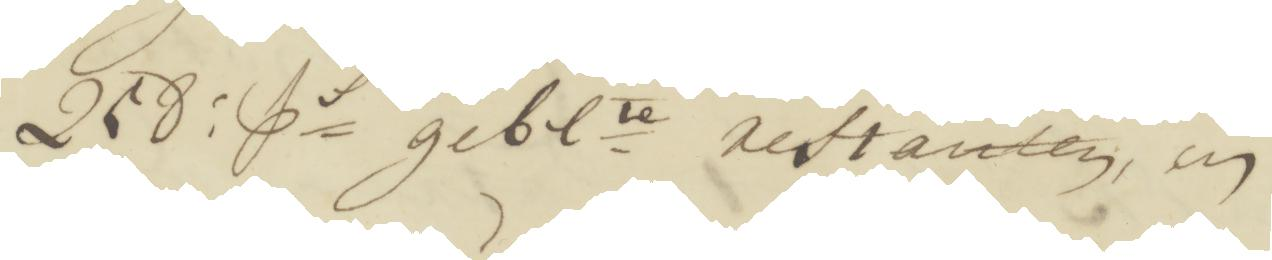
258: p=s gebl=te restanten, en
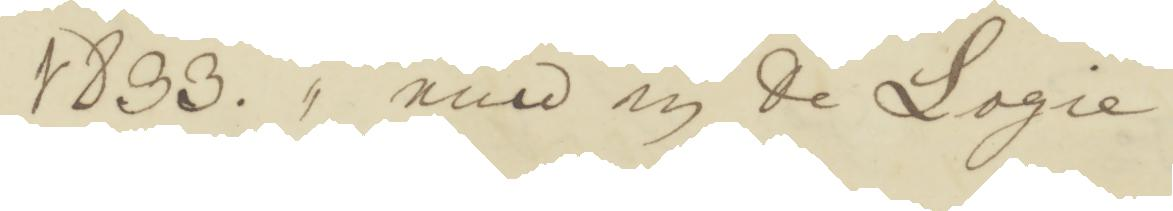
1833. „ ruw in de Logie
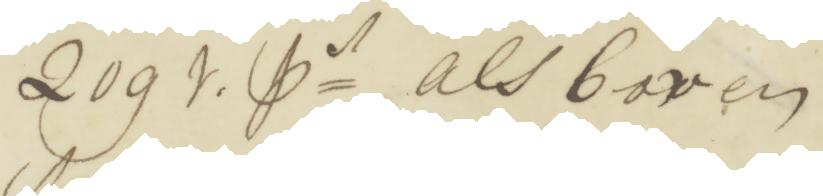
2091. p=s als boven
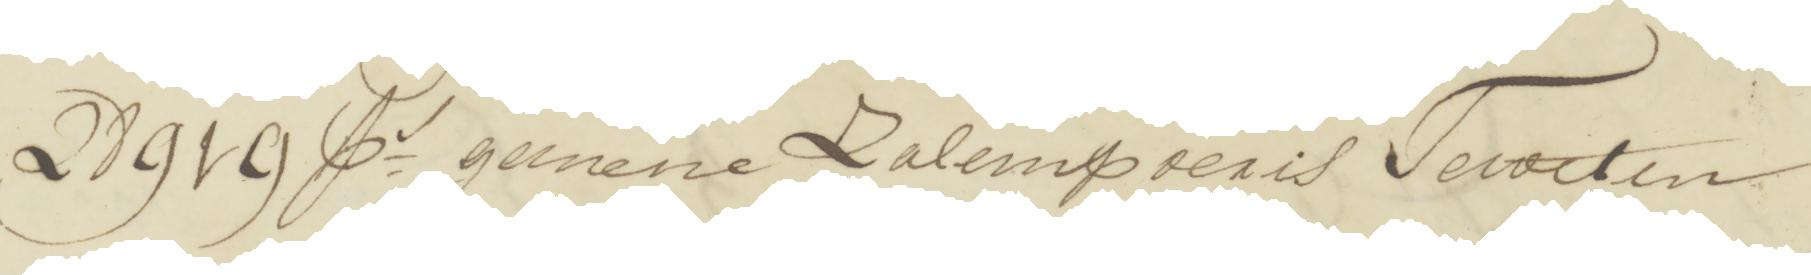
28919 p=s gemene Zalempoeris Teweten
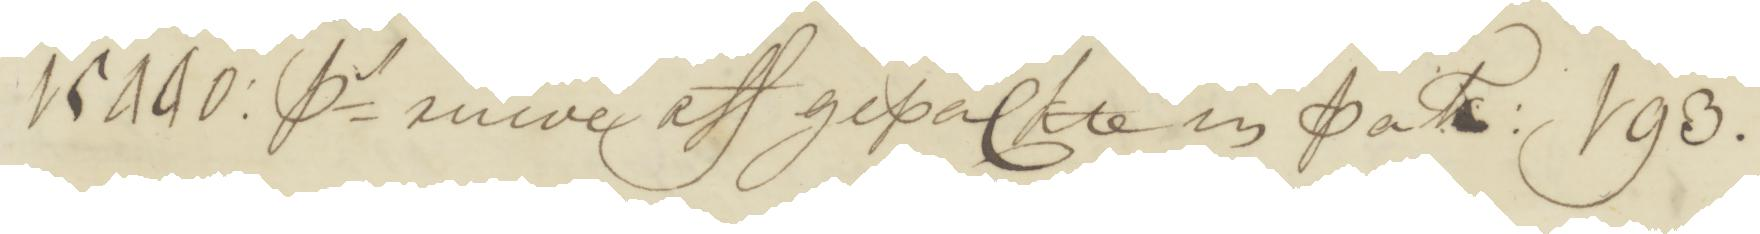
15440: p=s ruwe aff gepackte in pak: 193.
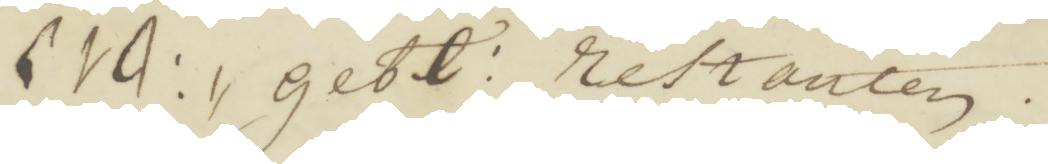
514: „ gebl: restanten.
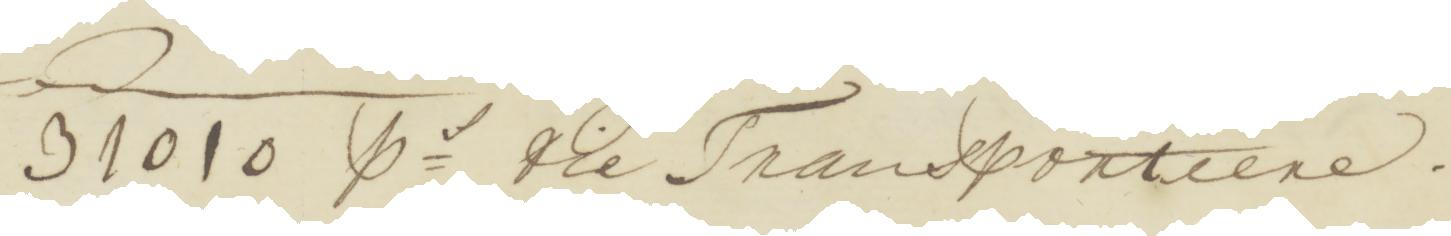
31010 p=s die Transporteere.
